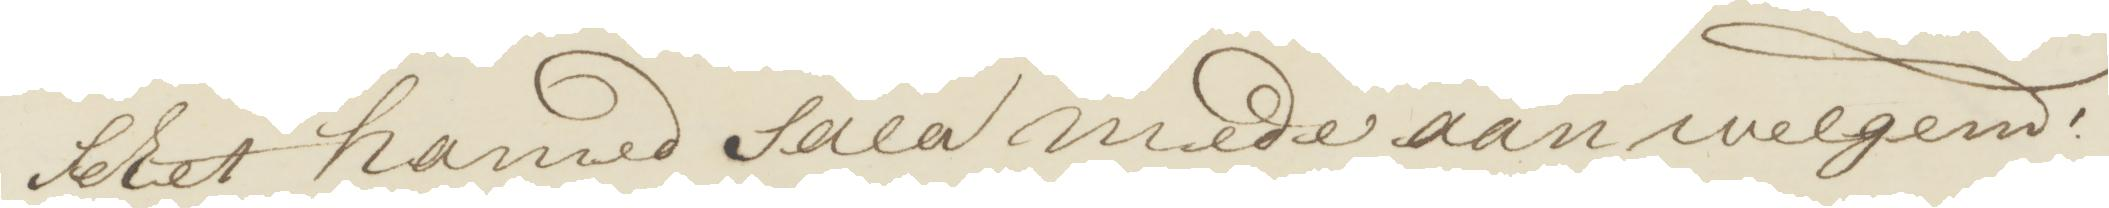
schet hamed sala mede aan welgem:
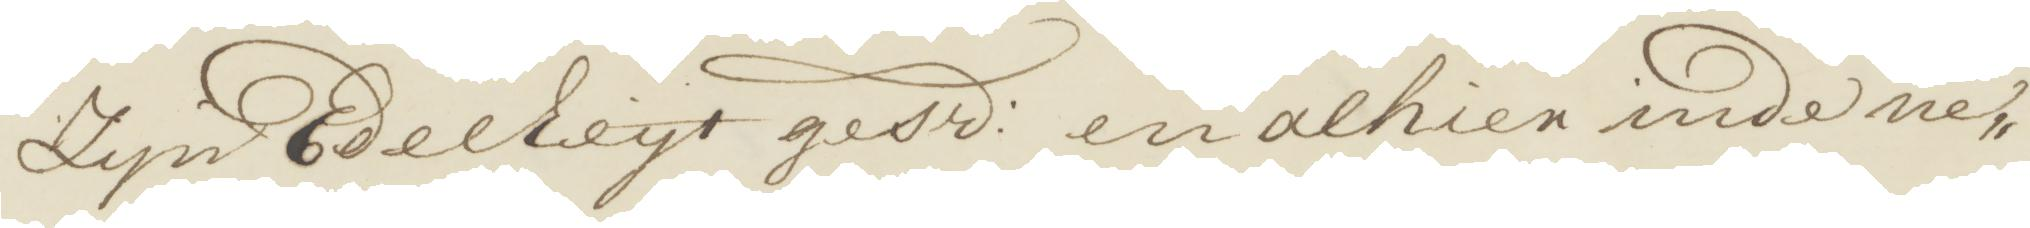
zijn Edelheijt gesr: en alhier inde ne„
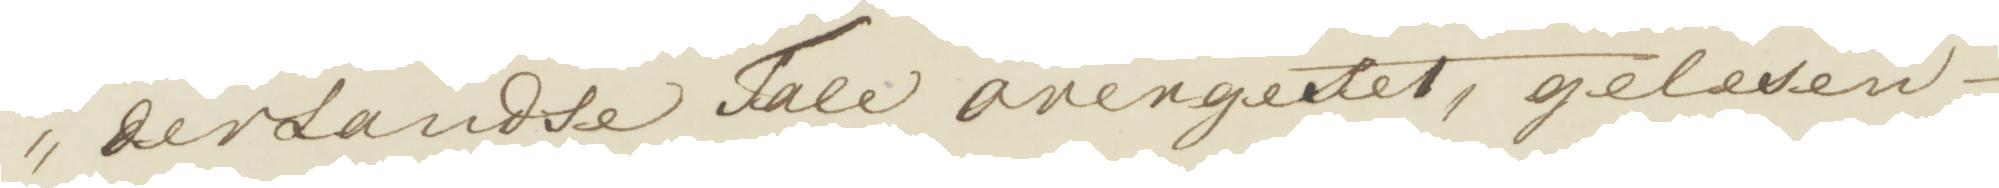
„derlandse Tale overgeset, gelesen—
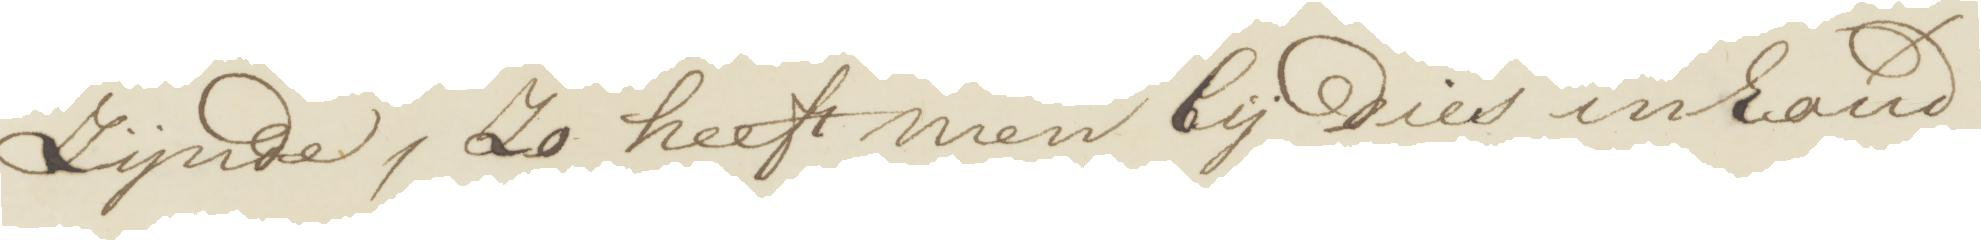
zijnde, zo heeft men bij dies inhoud
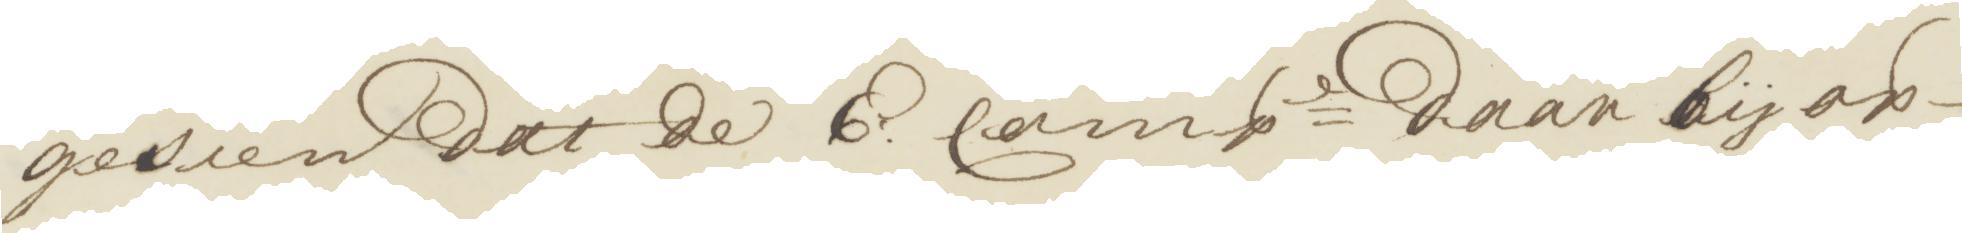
gesien dat de E: Comp=e daar bij op
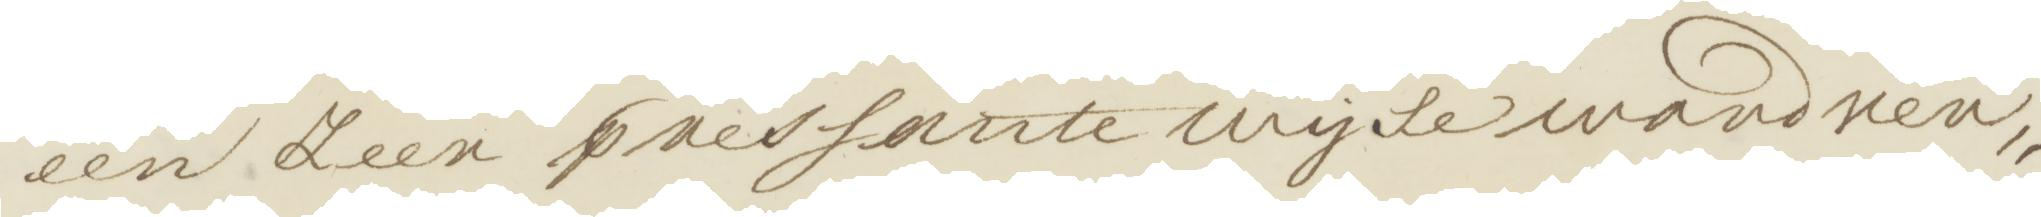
een zeer pressante wijse word ver„
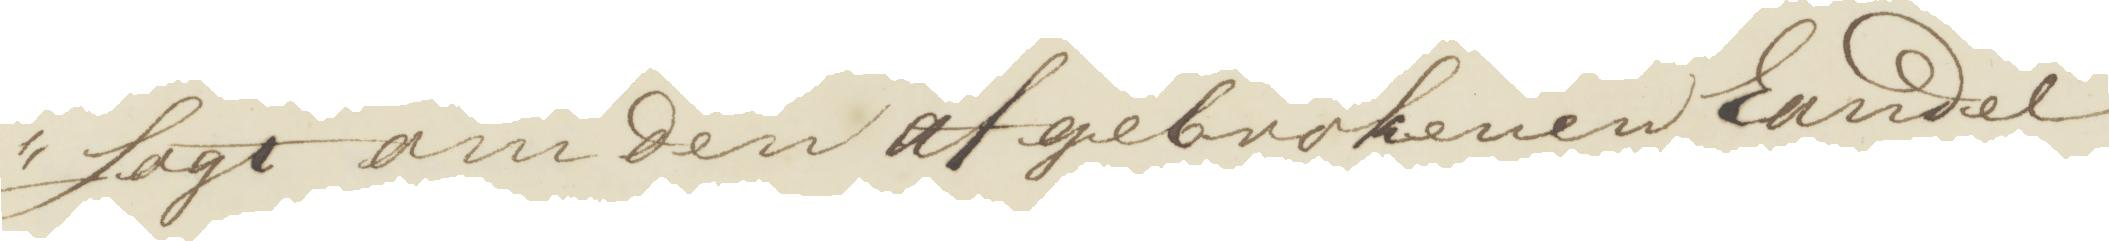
„sogt om den afgebrokenen handel
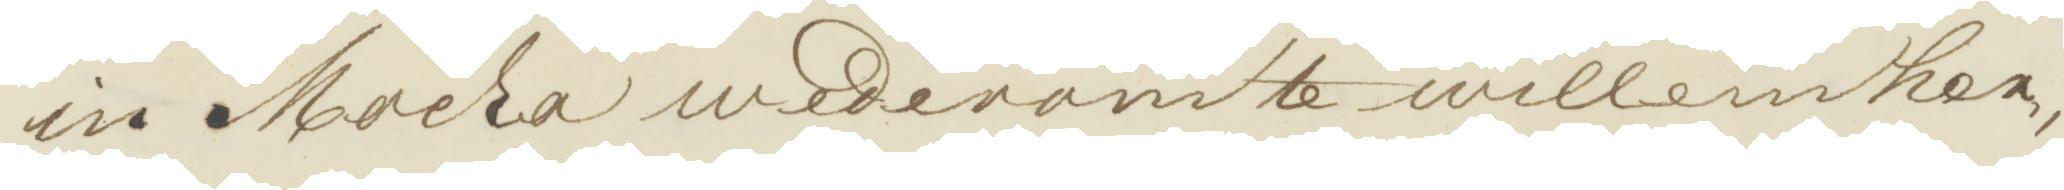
in Mocha wederom te willem her„
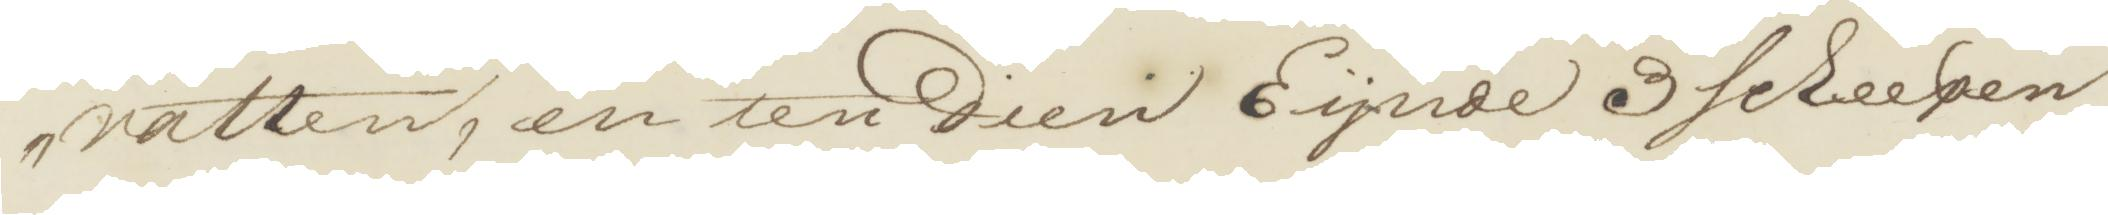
„vatten, en ten dien Eijnde 3 scheepen
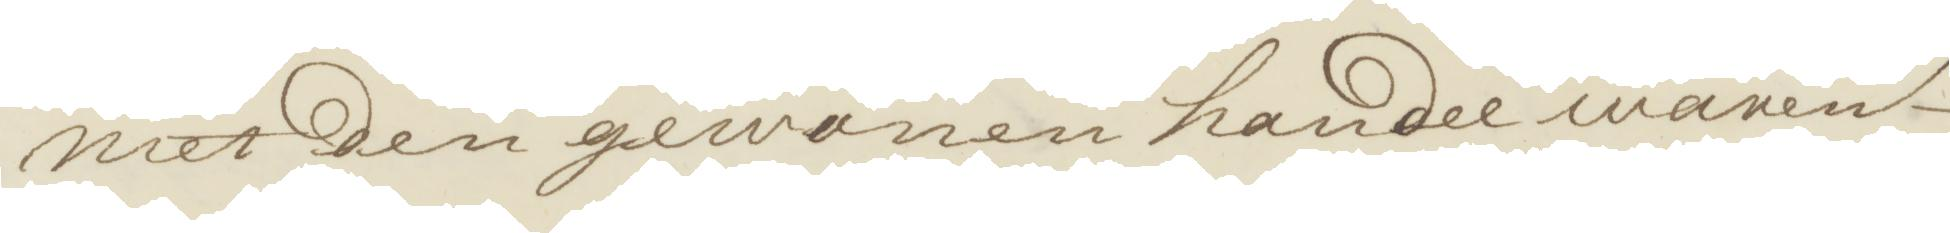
met den gewonen handel waren-
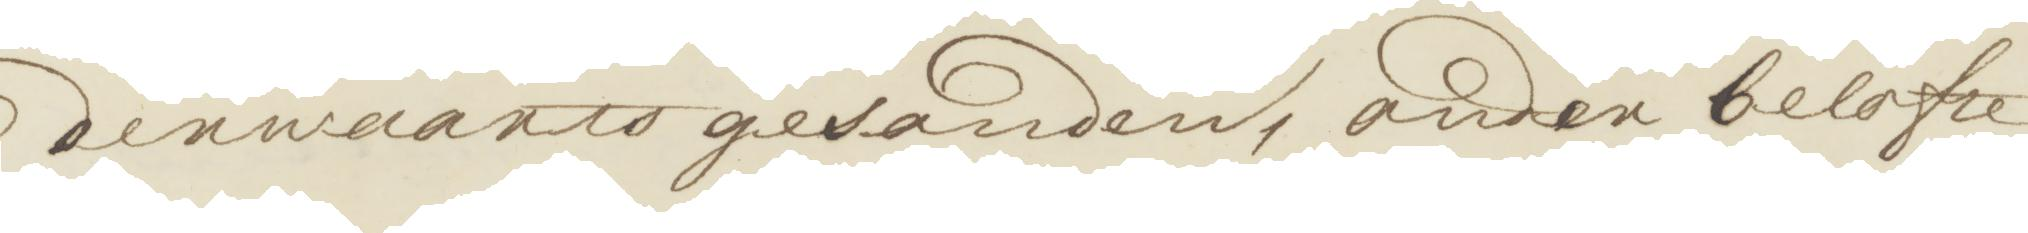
derwaarts gesonden, onder belofte
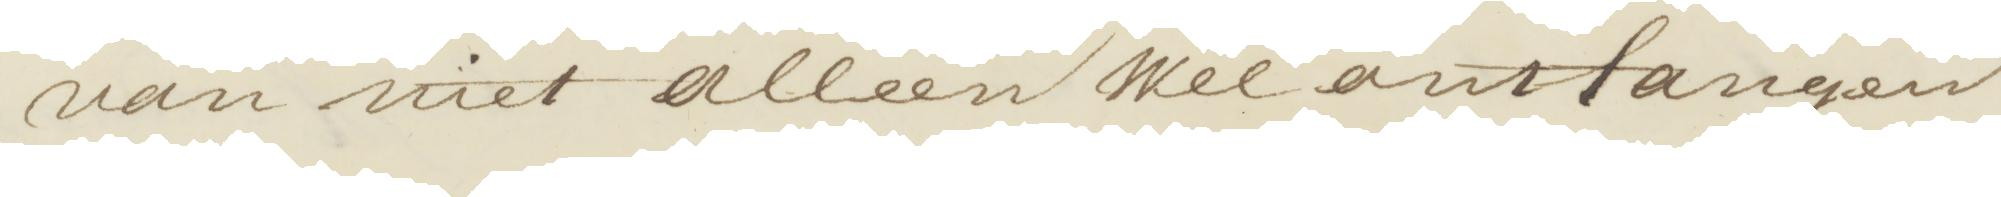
van niet alleen wel ontfangen
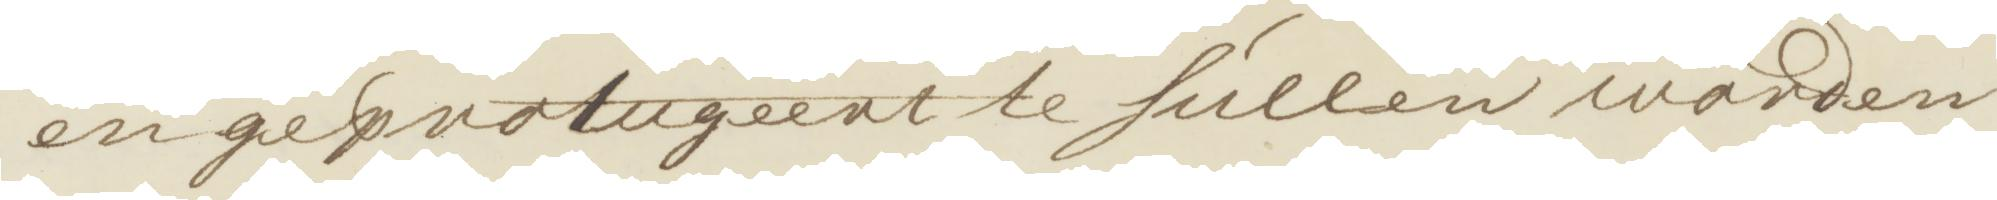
en geprotugeert te sullen worden
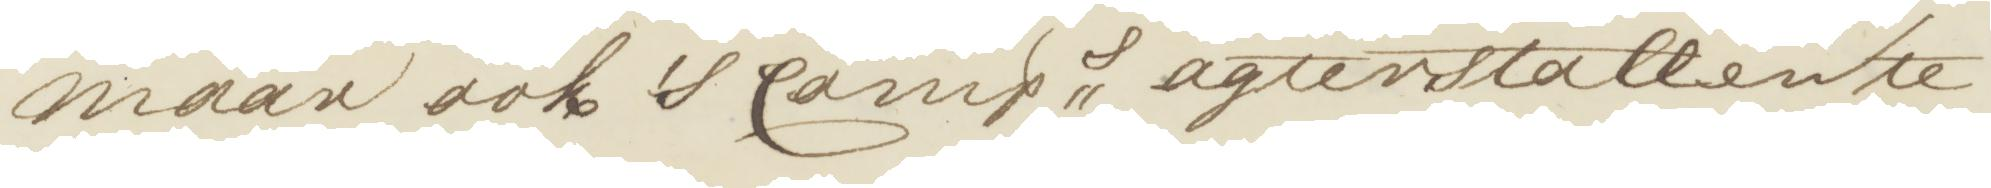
maar ook ’s Comp„s agterstallen te
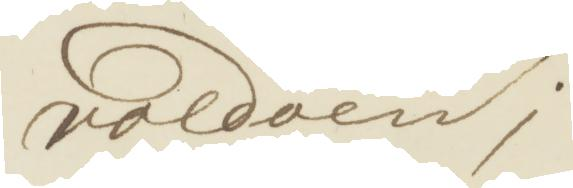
voldoen;
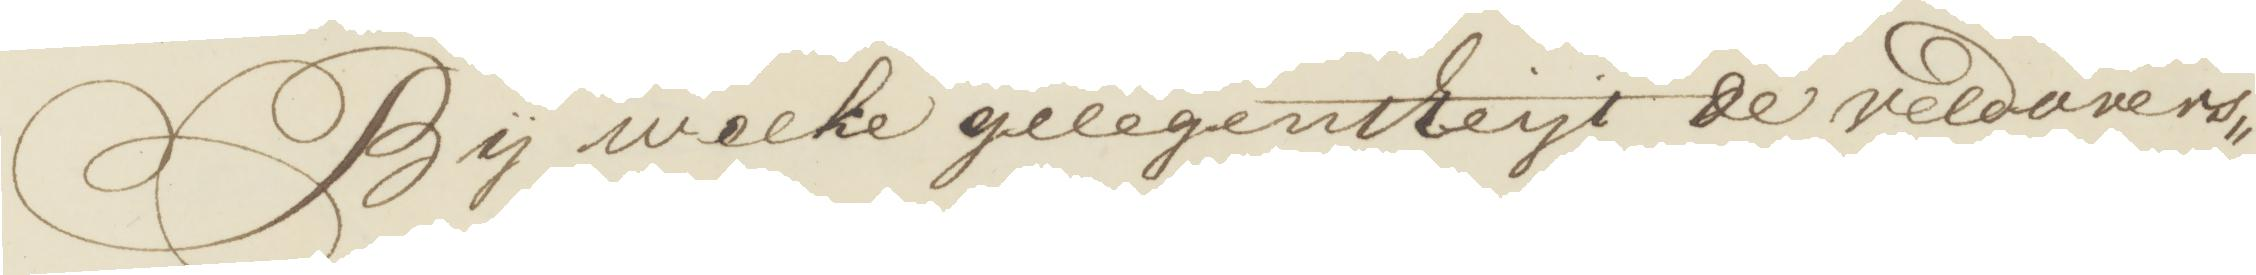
Bij welke gelegentheijt de veldovers„
